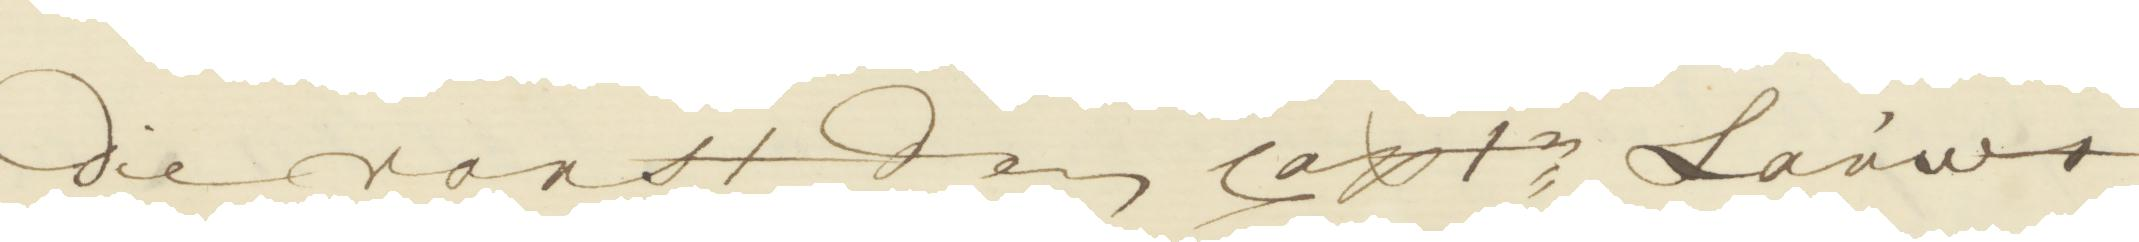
die vorst den capt„n Lauwt
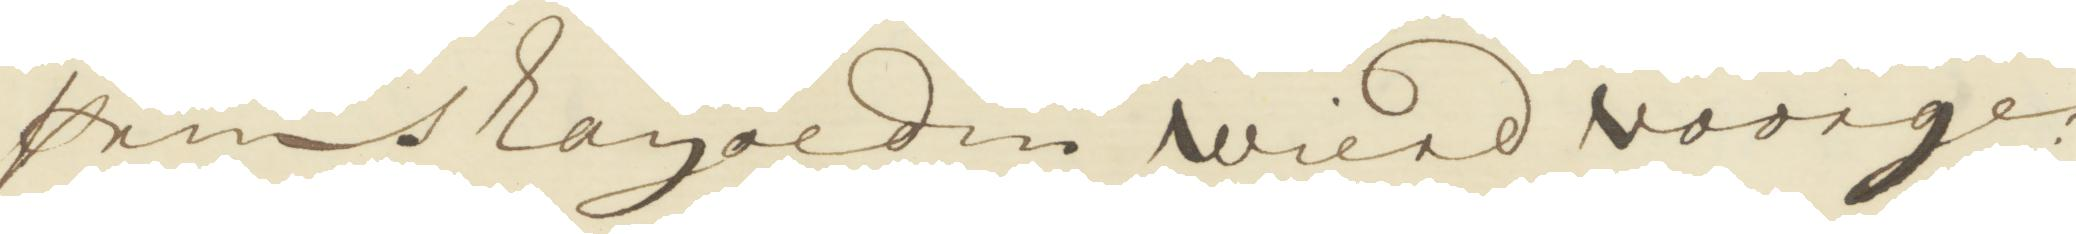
prins haijoedin wierd voorge
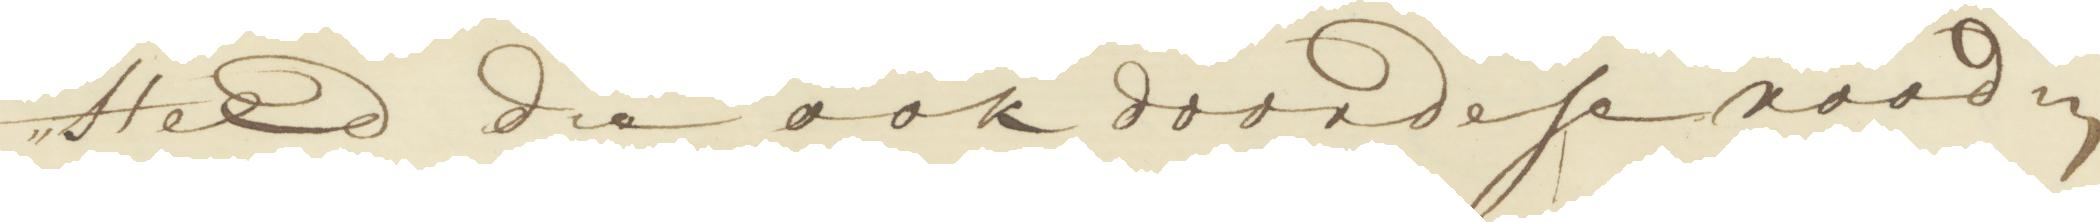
„steld die ook door dese raad in
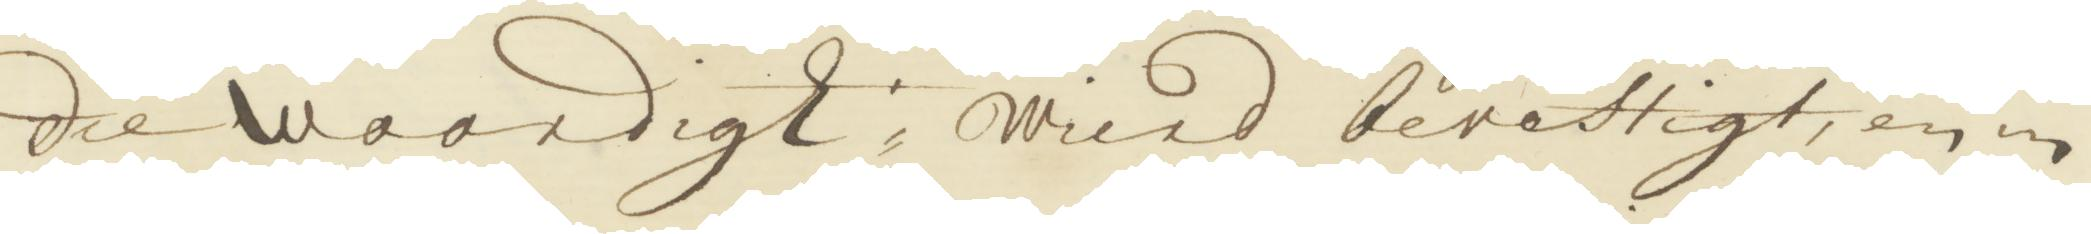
die woordigh„t wierd bevestigt, en in
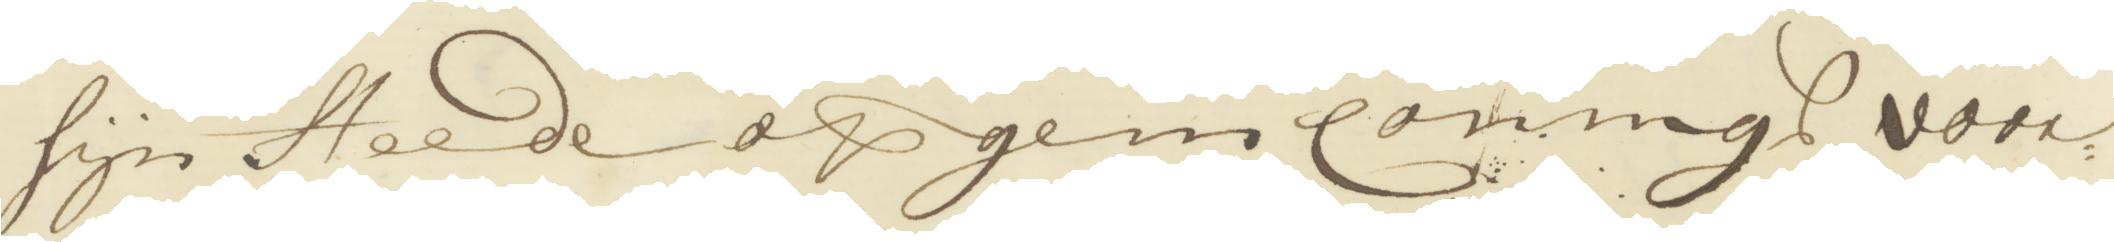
sijn steede op gem Conings voor=
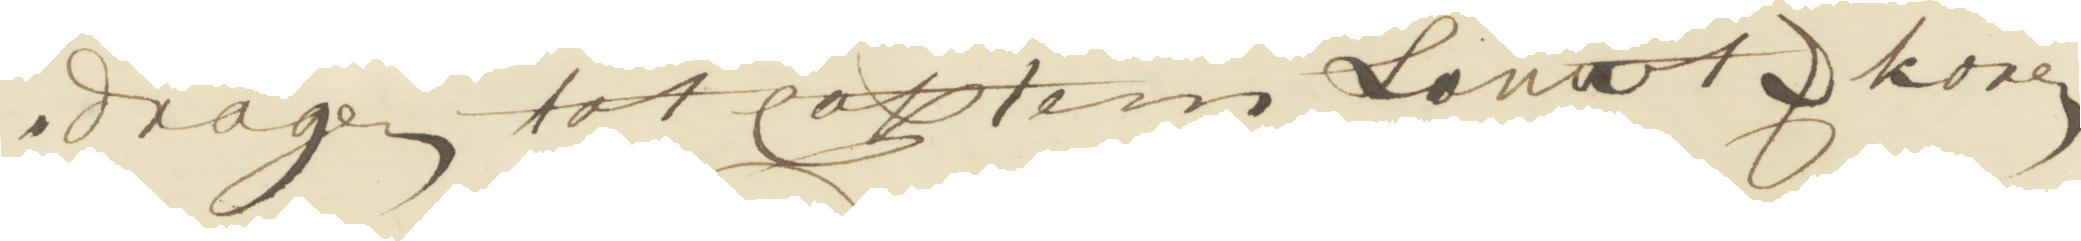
„dragen tot captein Lauwt verkozen
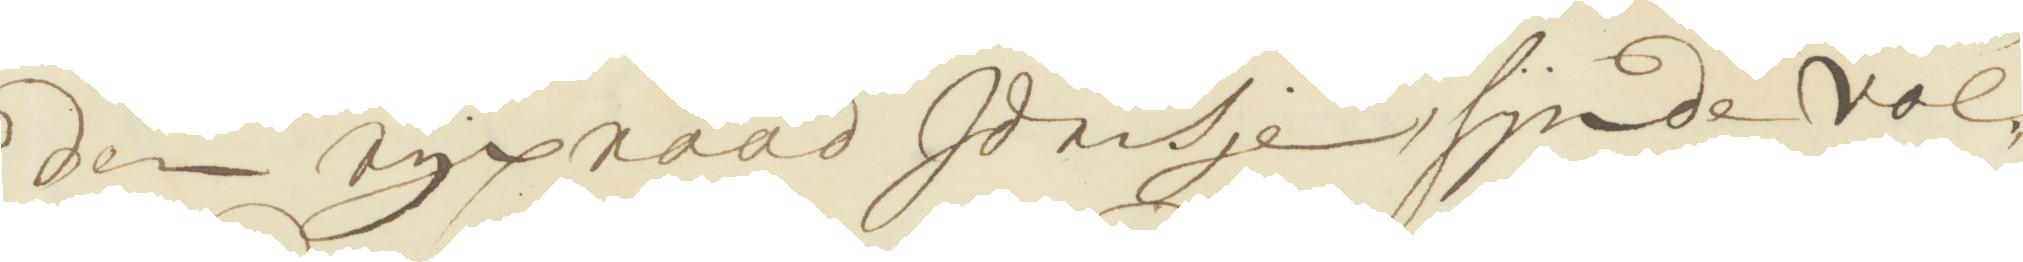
den rijxraad Jdrisje, sijnde vol
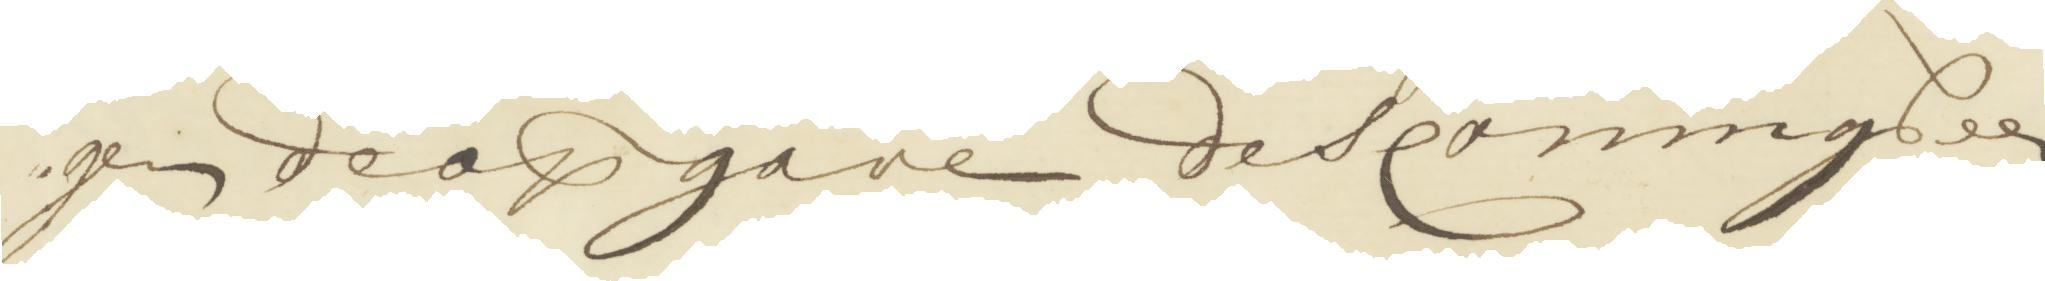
„gen de opgave des Conings een
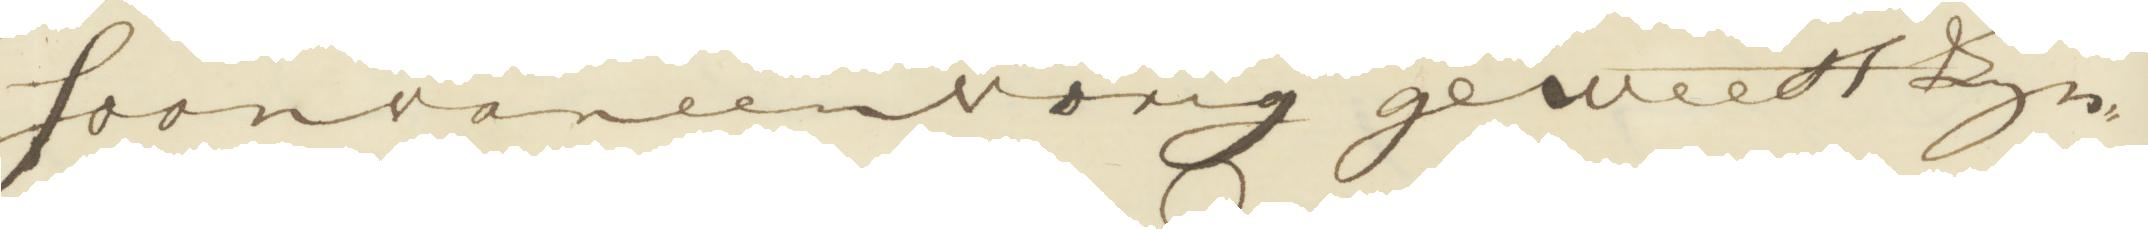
soon van een vorig geweest zijn„
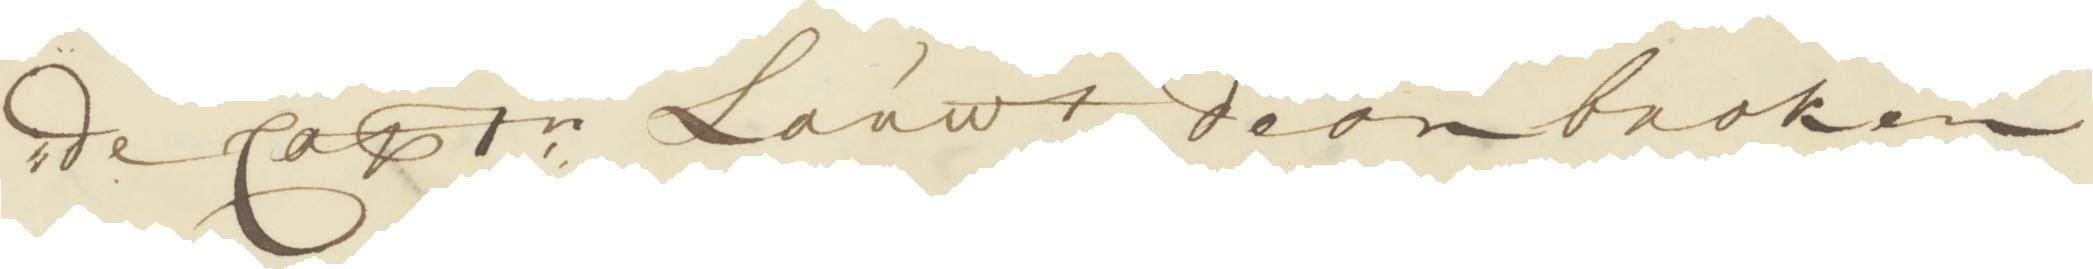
„de Capt„n Lauwt de onbroken
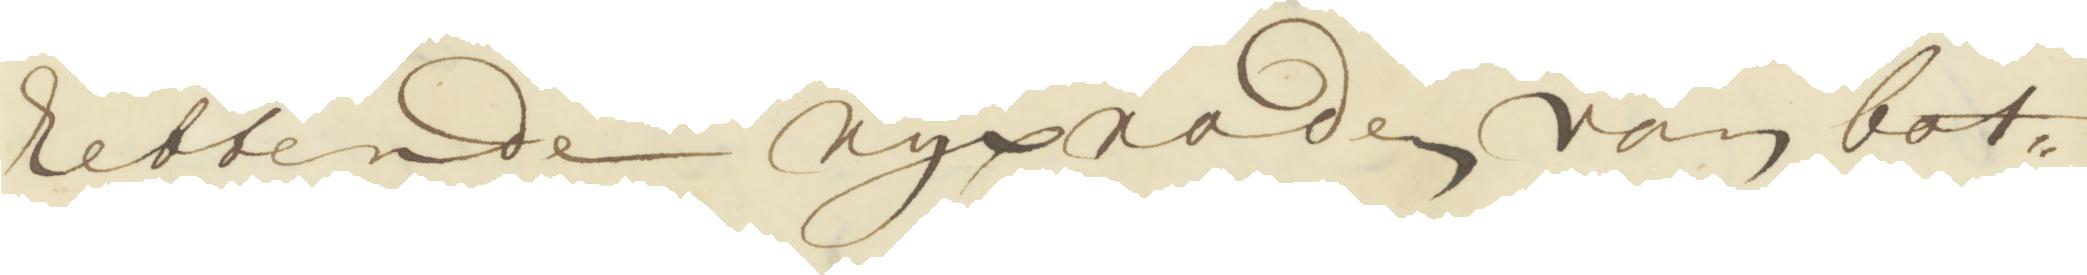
hebbende rijxraden van bat„
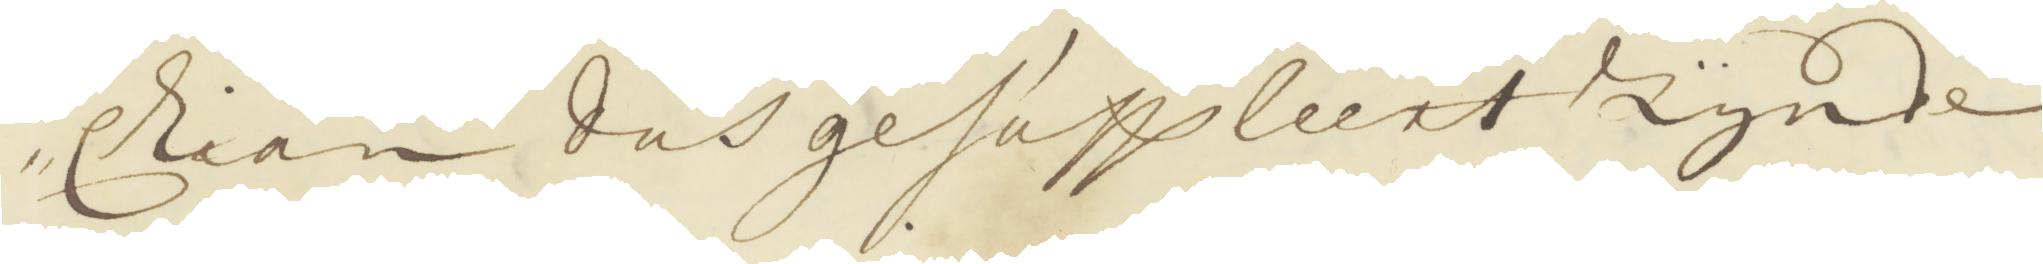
„chian dus gesuppleert zijnde
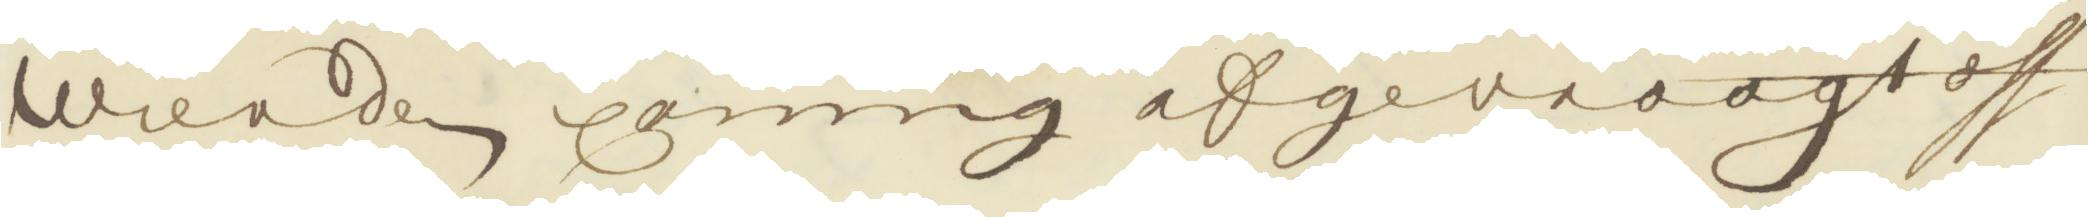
wierden Coning afgevraagt off
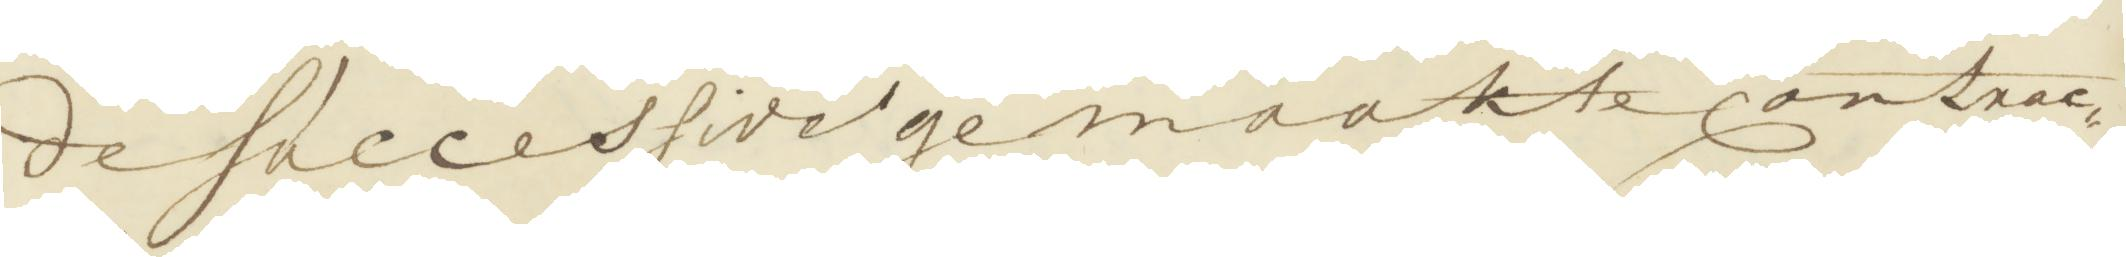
de successive gemaakte Contrac„
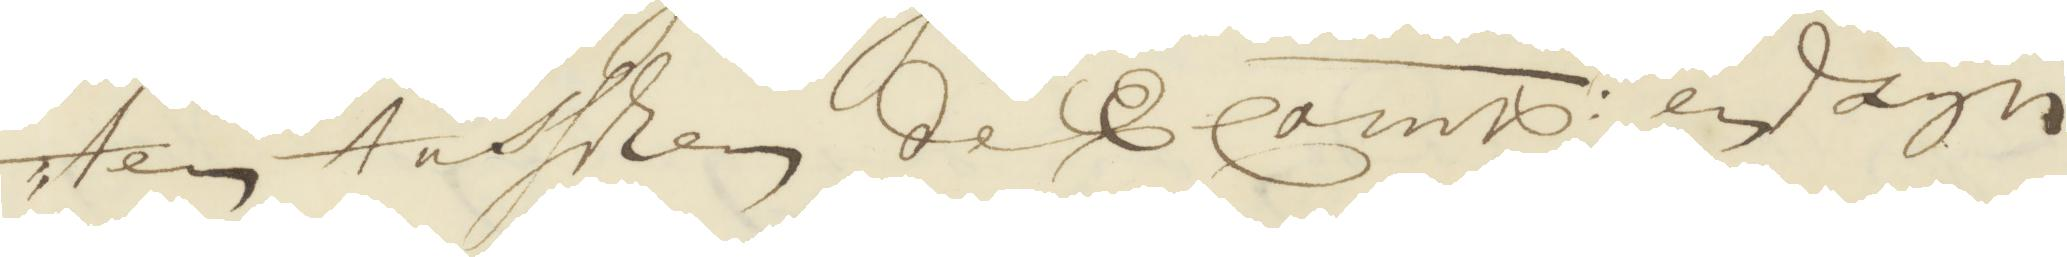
„ten tusschen de E Comp: en zijn
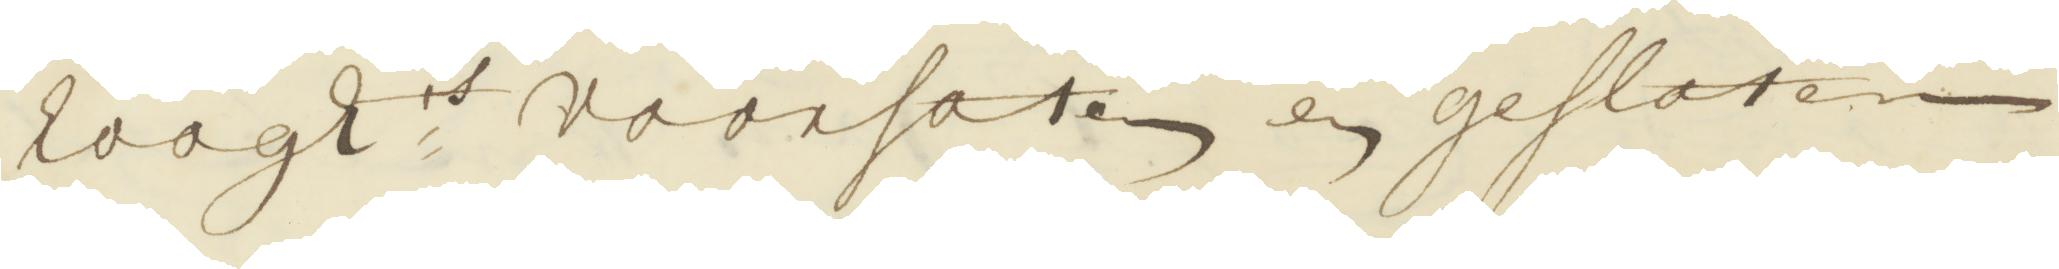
hoogh„ts voorsaten en gesloten
